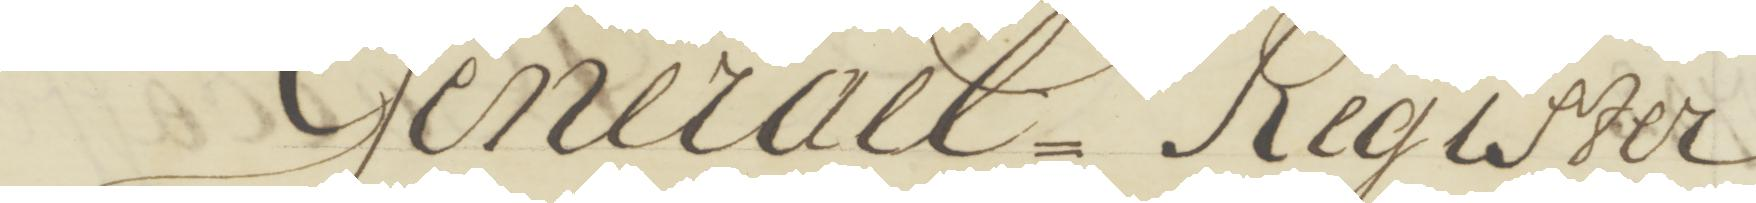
Generael = Register
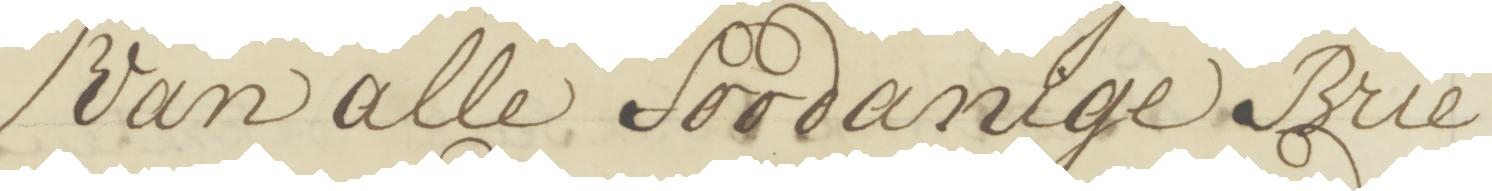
van alle soodanige Brie
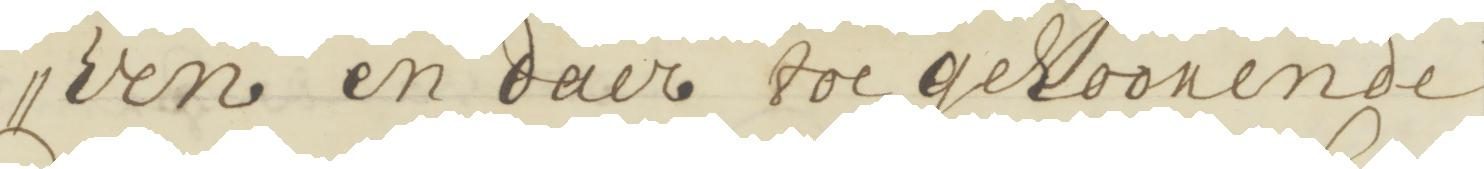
„ven en daer toe gehoorende
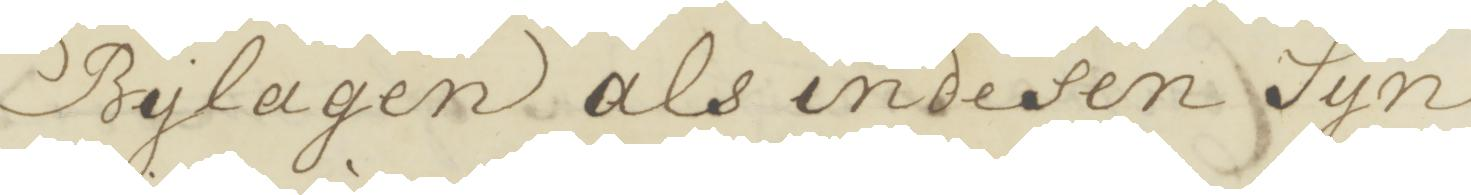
Bijlagen als in desen sijn
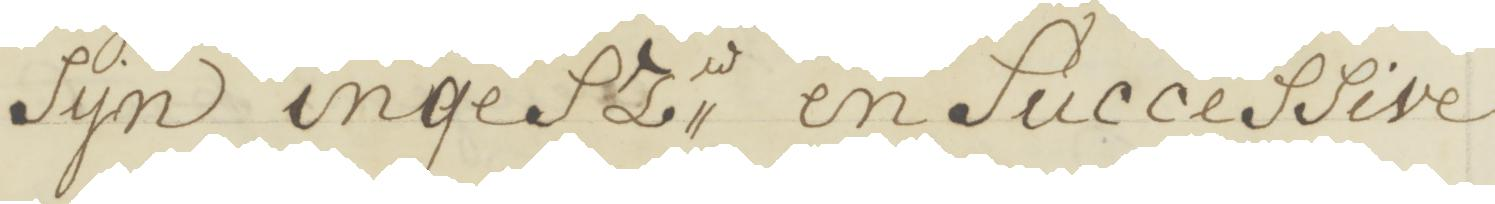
sijn ingesz„ld en successive
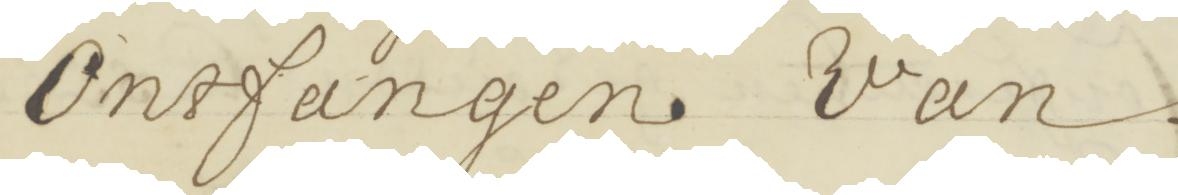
Ontfangen van
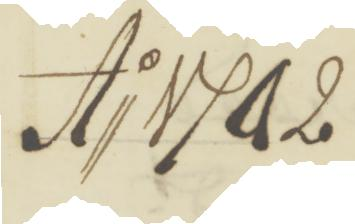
A„o 1742.
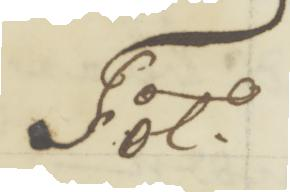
Fol.o
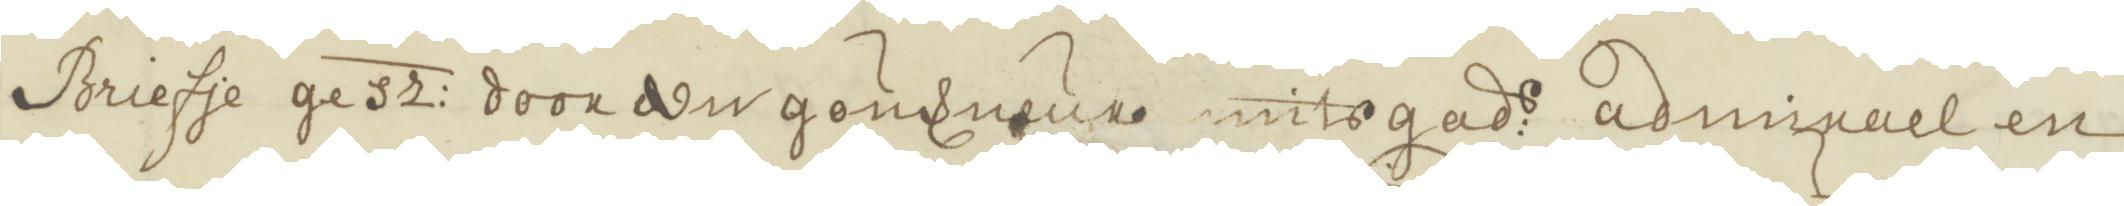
Briefje gesz: door den gouverneur mitsgad:s admirael en
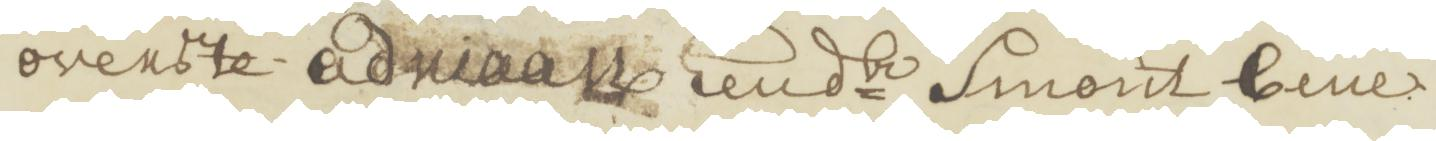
overste adriaan hend=k smout bene
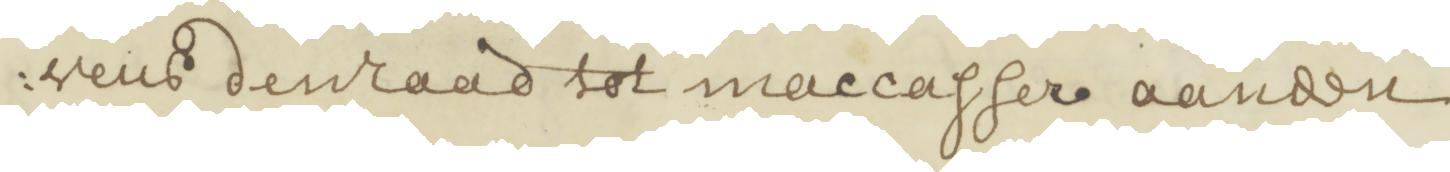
:vens den raad tot maccasser aanden
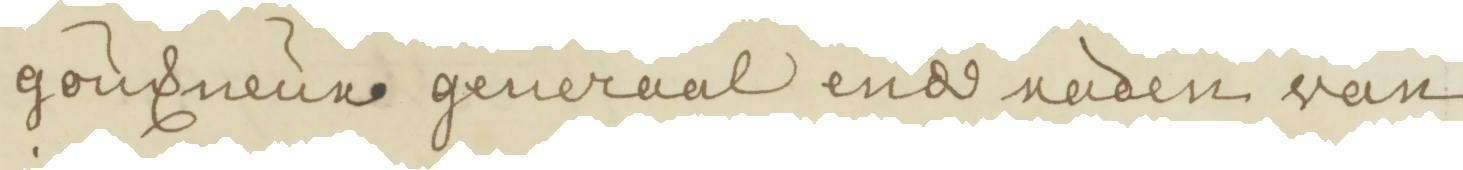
gouverneur generaal ende raden van
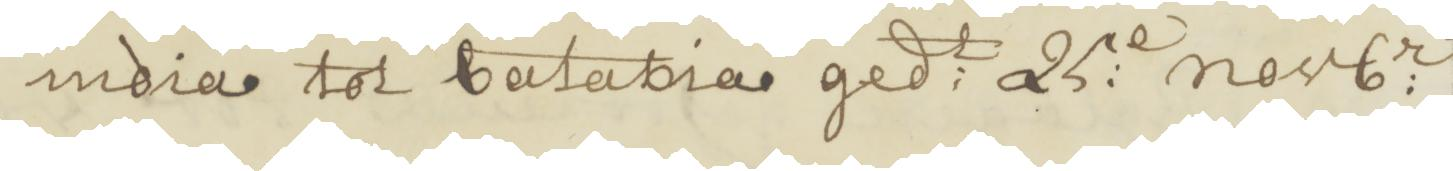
india tot batavia ged:t 25:e novb:r
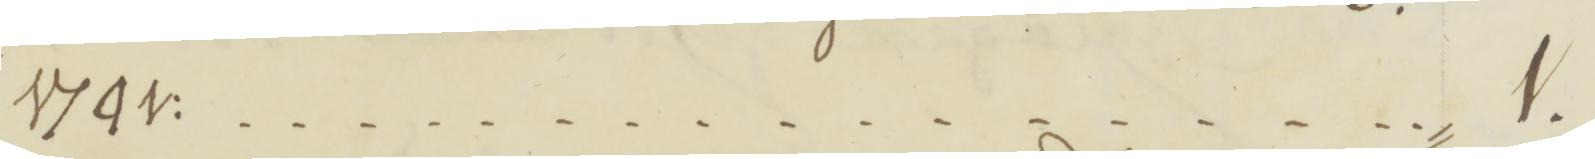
1741: - - - - - - - - - - - - - - - - -„ 1.
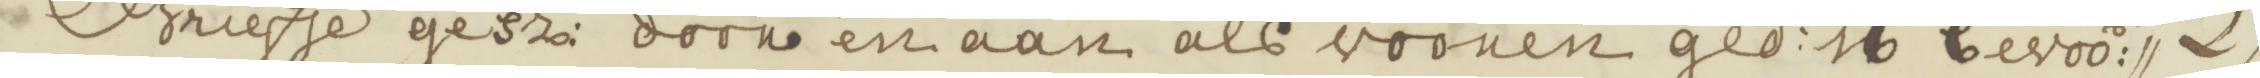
Briefje gesz: door en aan als vooren ged:t 16 bevoo:s „ 2
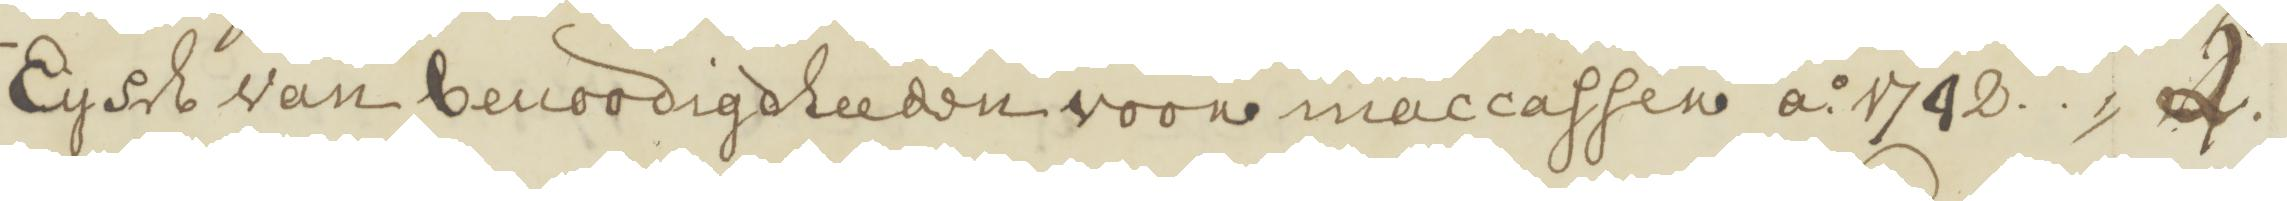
Eijsch van benoodigdheeden voor maccasser a:o 1742 . . „ 2.
